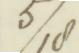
5/18
